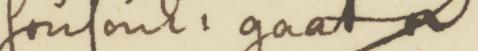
sousouh: gaat over
